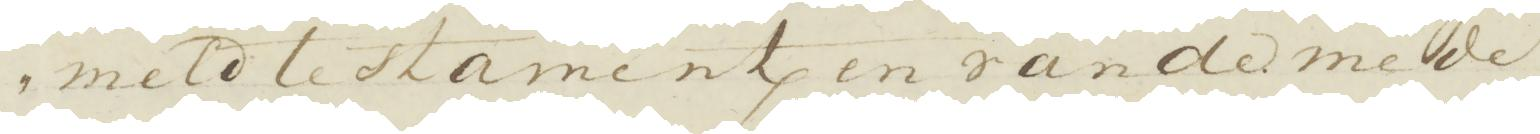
„ meld testament en van de mede
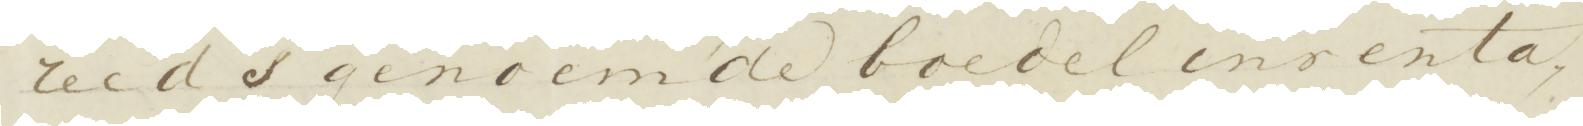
reeds genoemde boedel inventa„
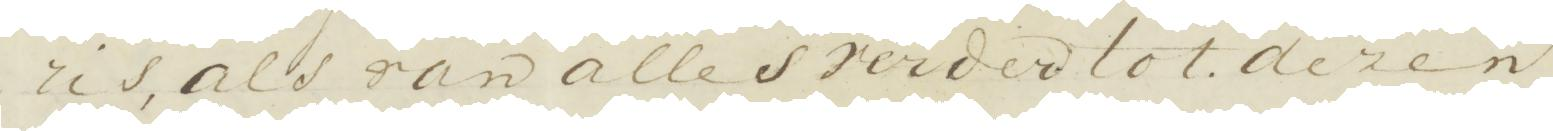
ris, als van alles verder tot dezen
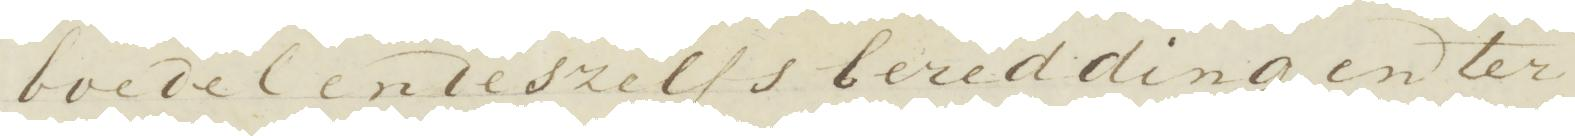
boedel en deszelfs beredding en ter
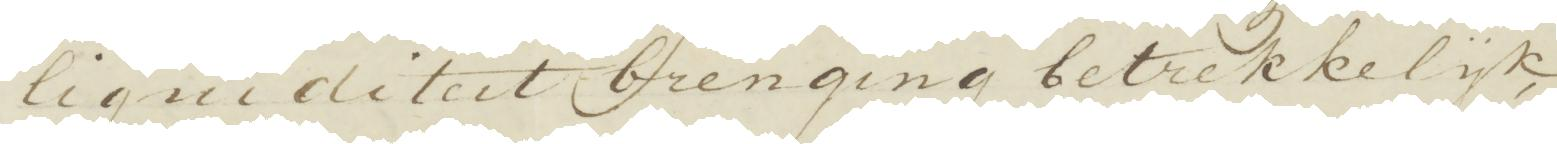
liquiditeit brenging betrekkelijk,
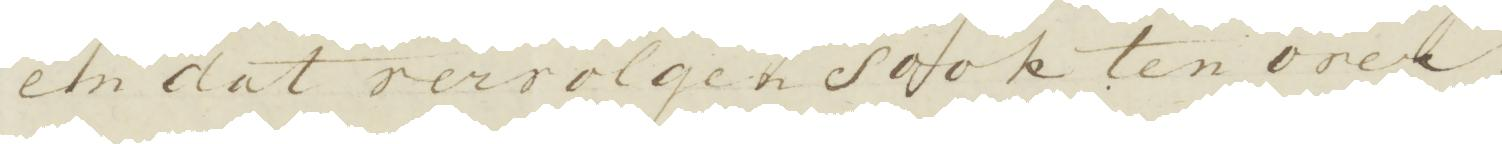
en dat vervolgens ook ten over
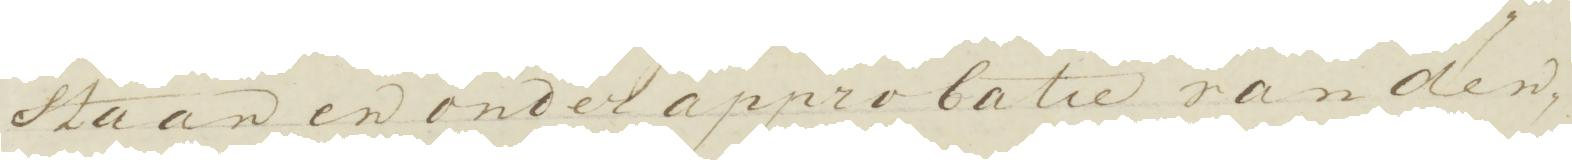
staan en onder approbatie van den„
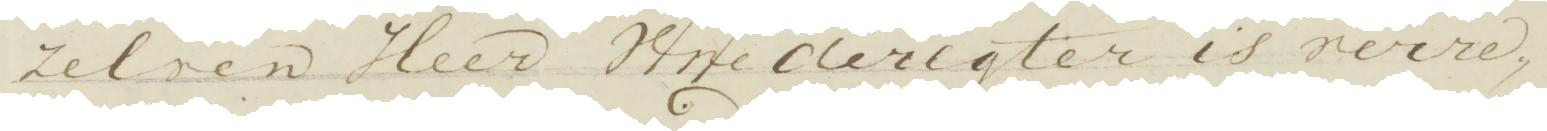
zelven Heer Vrederegter is verre„
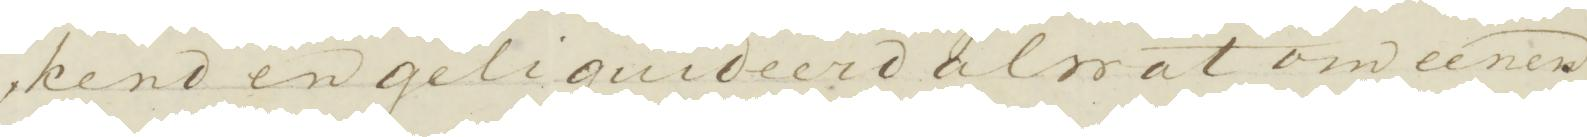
kend en geliquideerd alwat om eenen
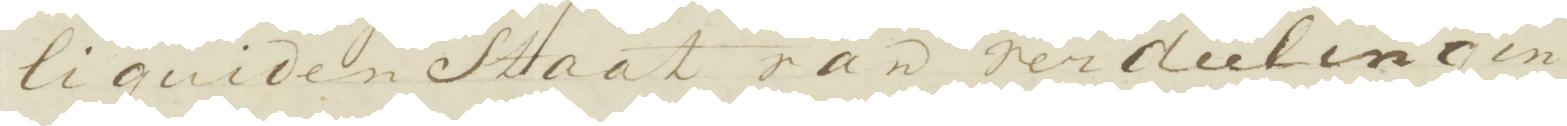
liquiden staat van verdeeling in
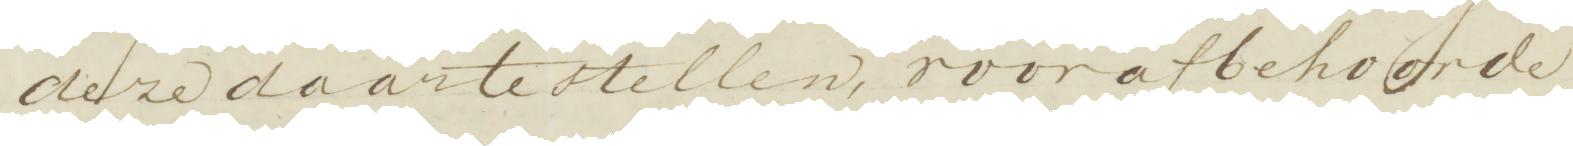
deze daar te stellen, voorafbehoorde
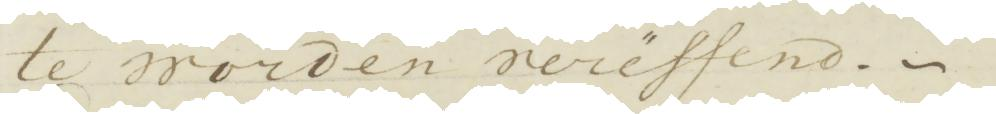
te worden verëffend.—
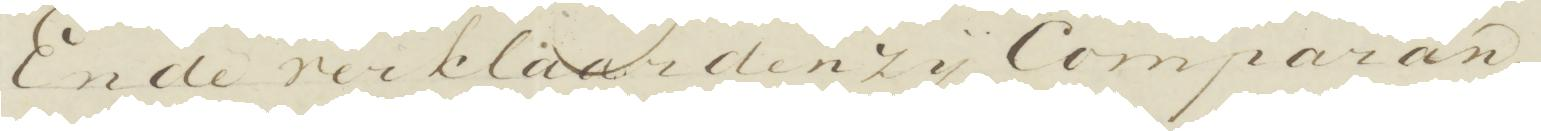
Ende verklaarden zij Comparan
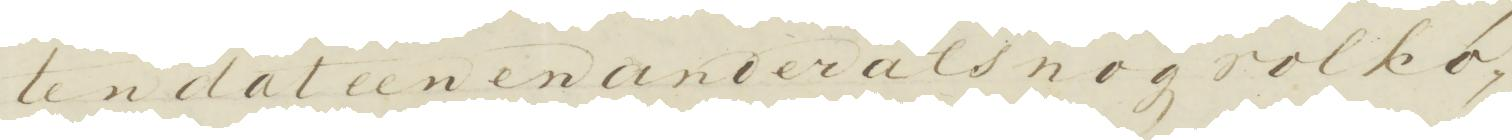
ten dat een en ander als nog volko„
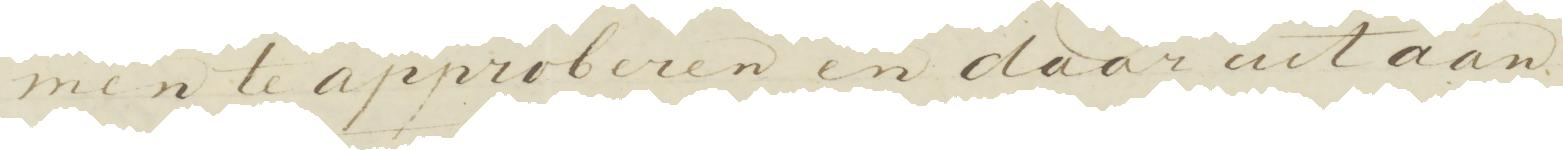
men te approberen en daar uit aan
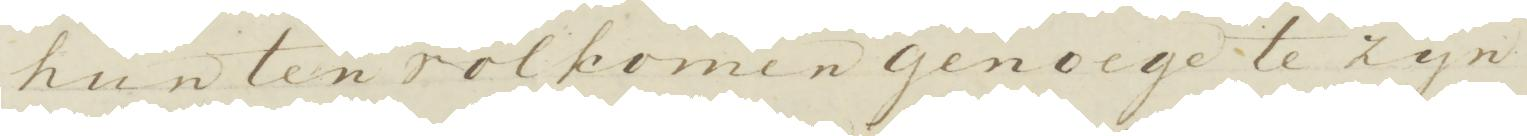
hun ten volkomen genoege te zyn
